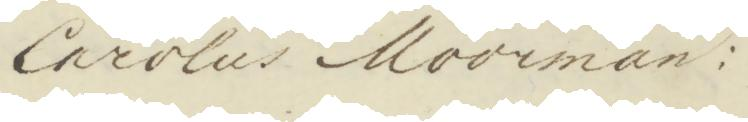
Carolus Moorman:
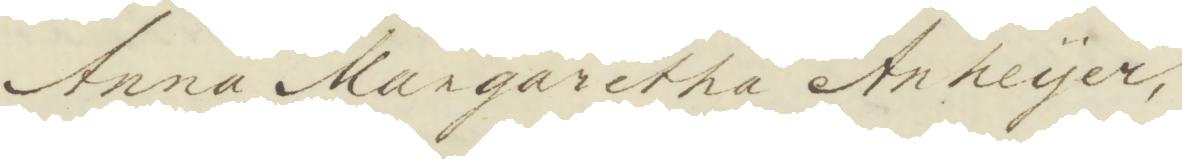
Anna Margaretha Anheijer,
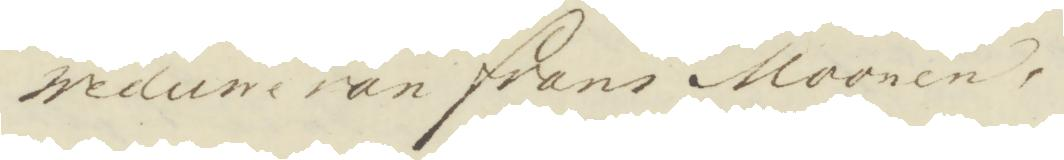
weduwe van Frans Moonen,
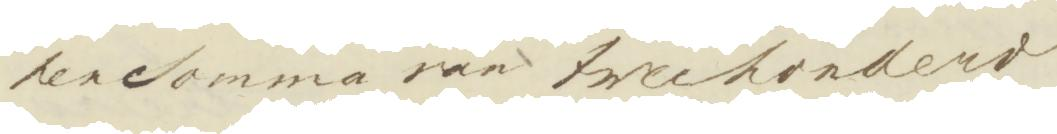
ter somma van tweehonderd
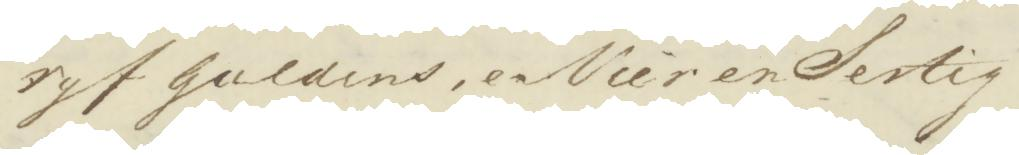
vyf guldens, en vier en Sestig
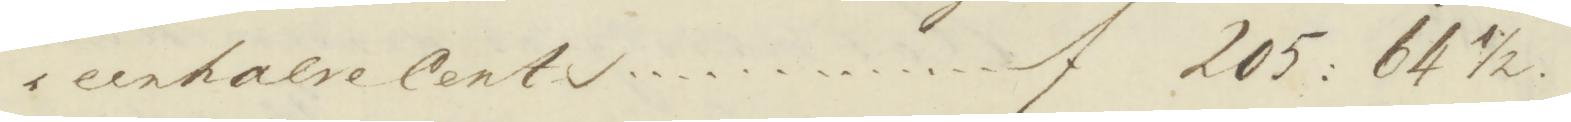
en eenhalve Cents - - - - - - - - - - - - - ƒ 205: 64½.
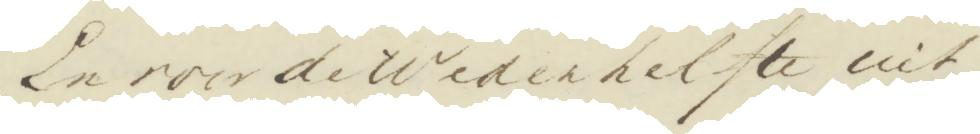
En voor de Wederhelfte uit
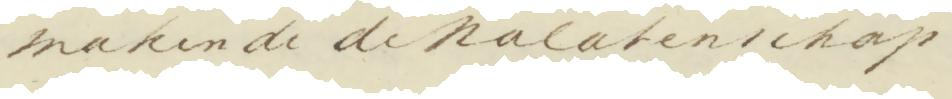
makende de Nalatenschap
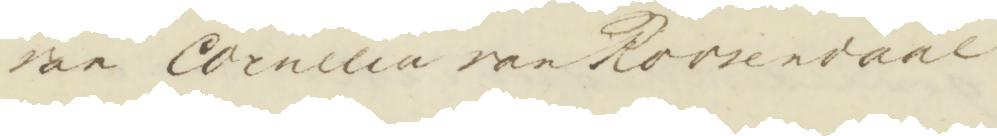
van Cornelia van Roosendaal
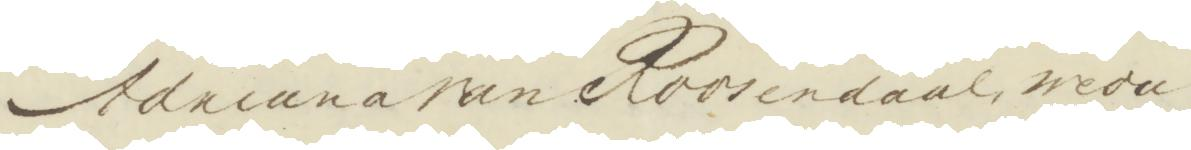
Adriana van Roosendaal, wedu
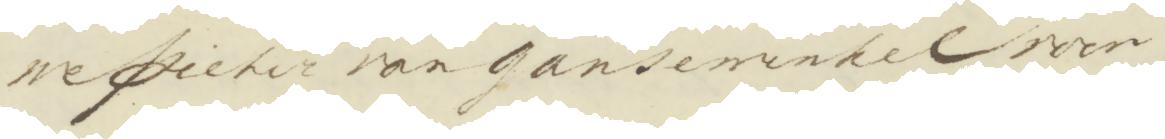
we Pieter van Gansewinkel voor
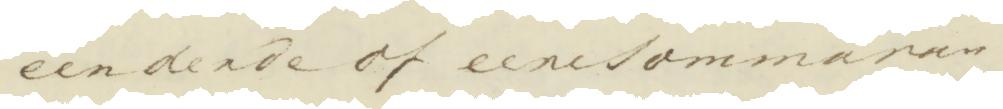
een derde of eenesomma van
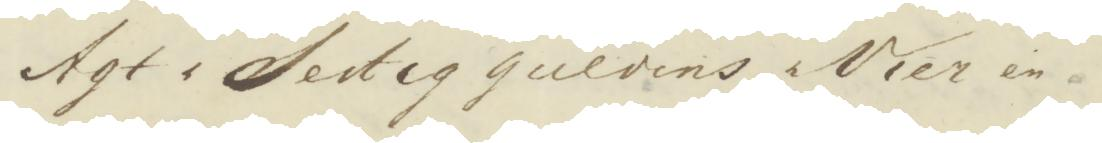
Agt en Sestig guldens en Vier en
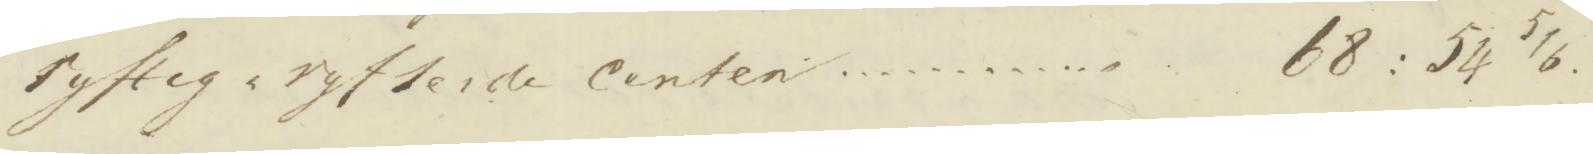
vyftig en vyfsesde centen . . . . . . . . . „ 68 : 54 5/6.
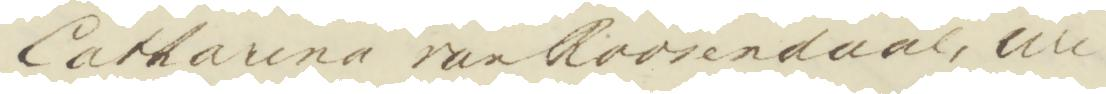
Catharina van Roosendaal, we
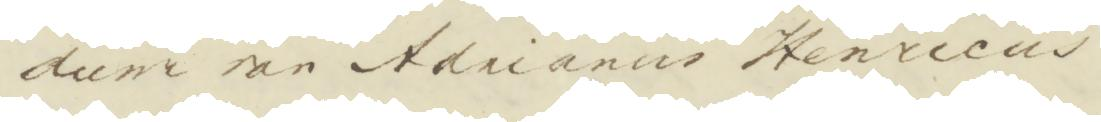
duwe van Adrianus Henricus
